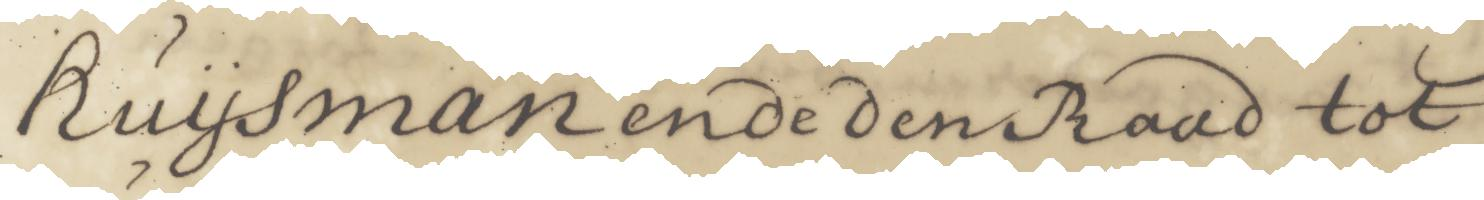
Huijsman ende den Raad tot
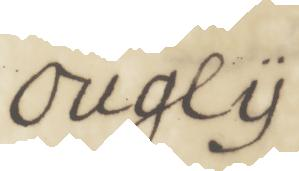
Ouglij
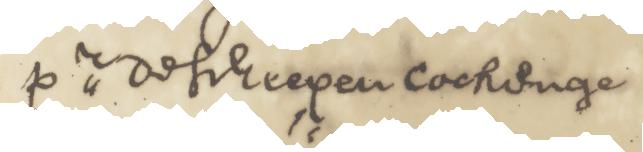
p„r de scheepen Cockenge
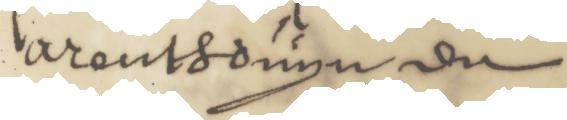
arentsduijn en
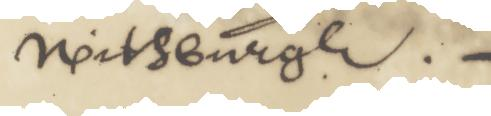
Witsburgh.
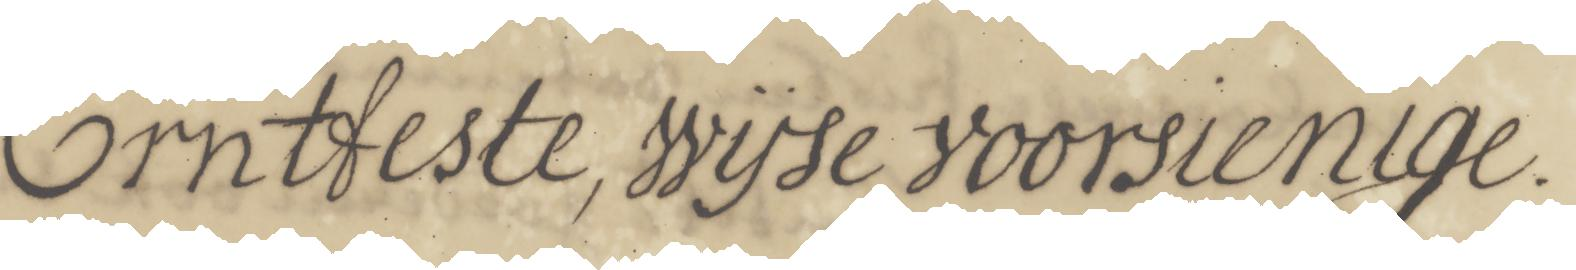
Erntfeste, wijse, voorsienige.
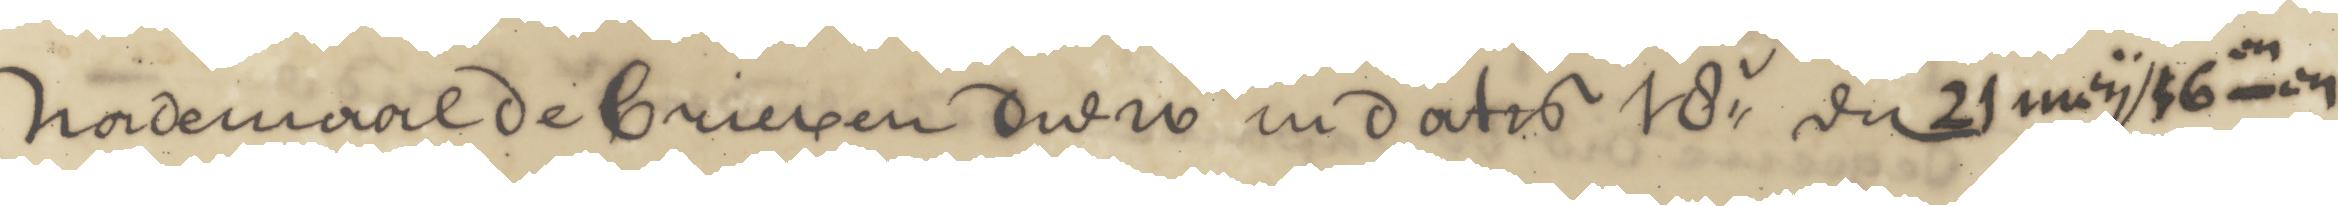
nademaal de brieven die u in datis 18„e en 21 meij/16en meij
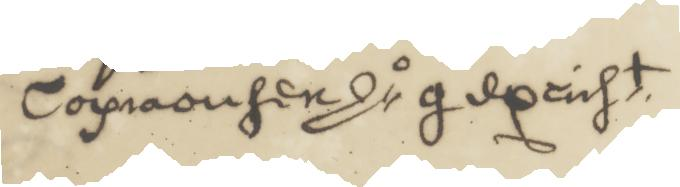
Copiaonser ver„o g excus„t
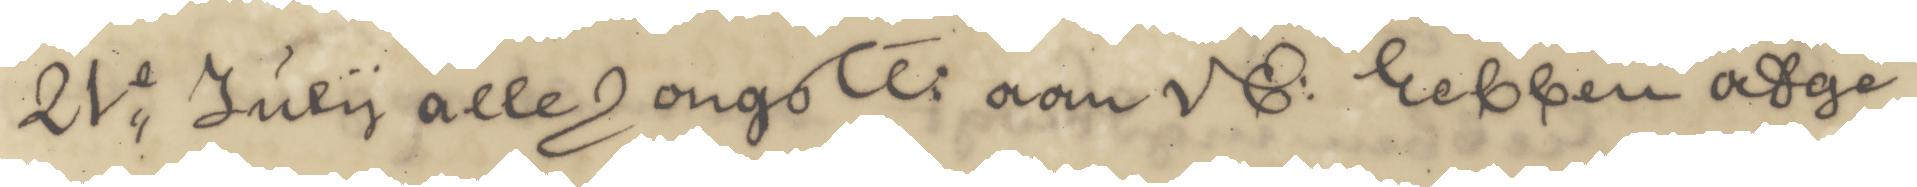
21„e Julij alle Jongstl: aan UE: hebben afge
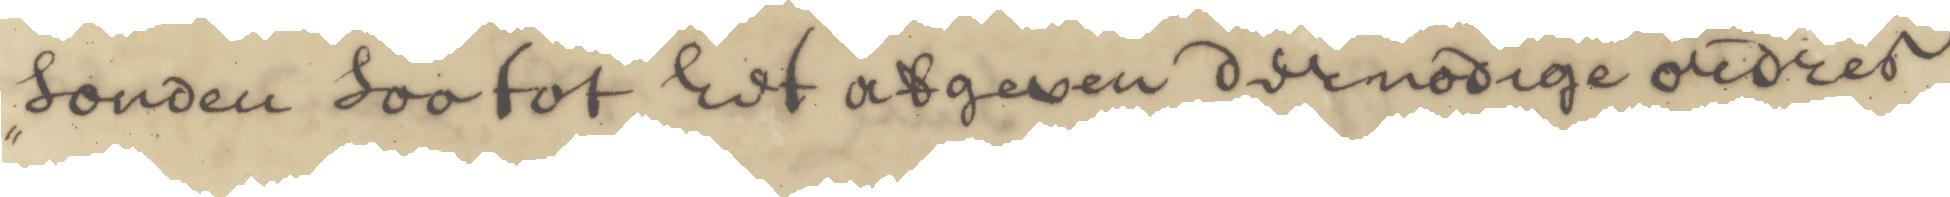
„sonden soo tot het afgeven der nodige ordres,
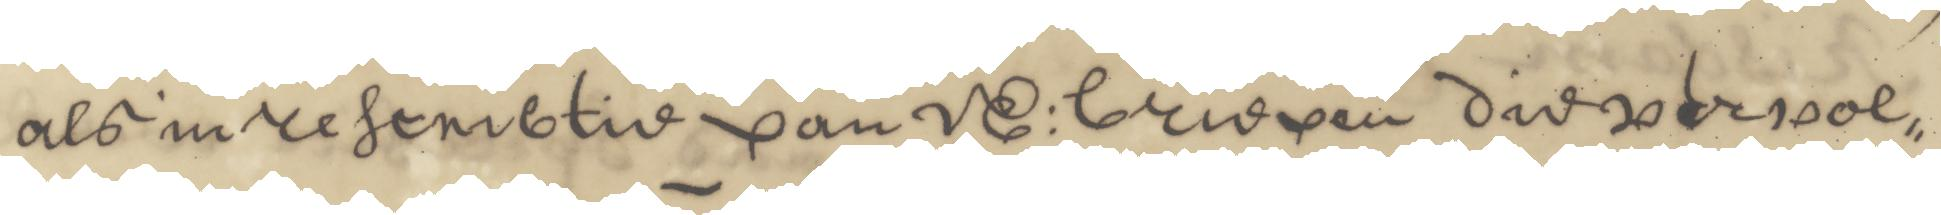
als in rescribtie van UE: brieven die vervol„
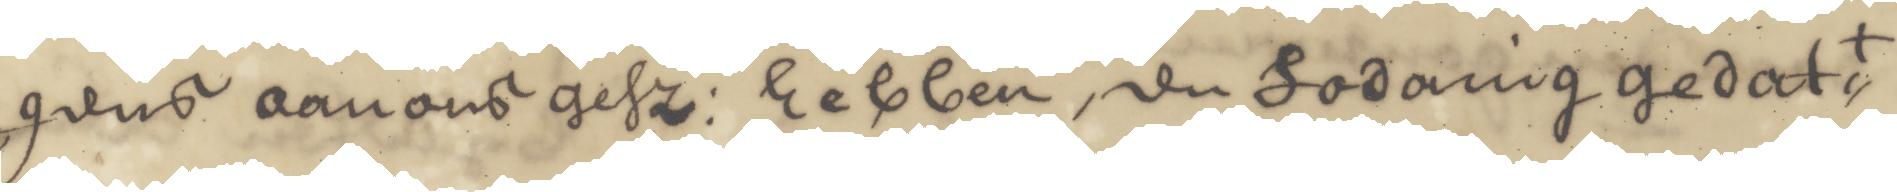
„gens aan ons gesz: hebben, en sodanig gedat„t
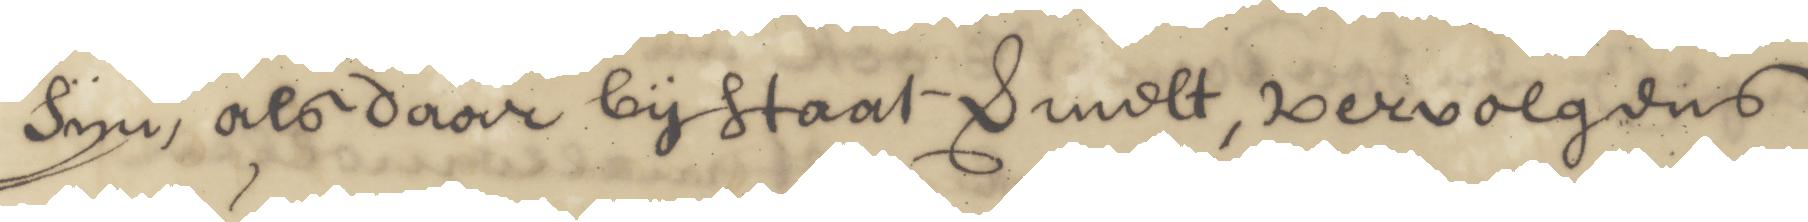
sijn, als daar bij staat vermelt, vervolgens
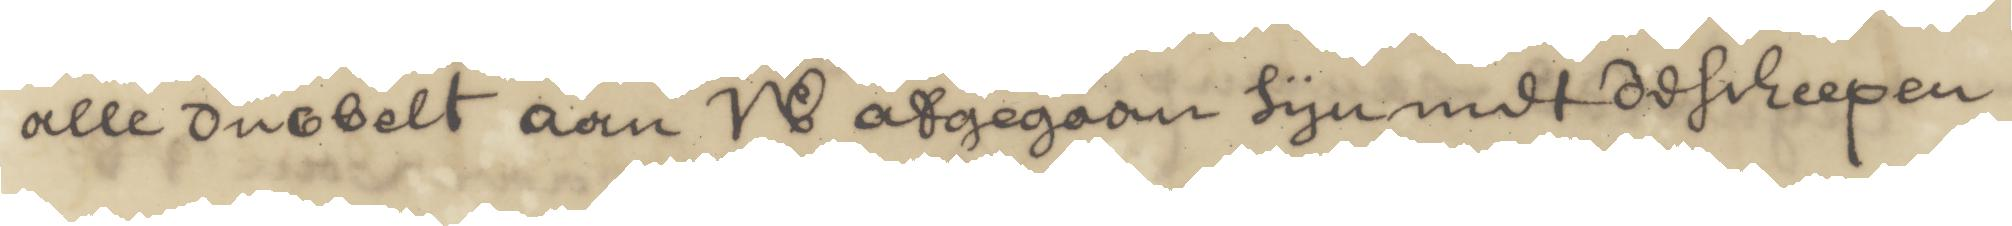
alle dubbelt aan UE afgegaan sijn met descheepen
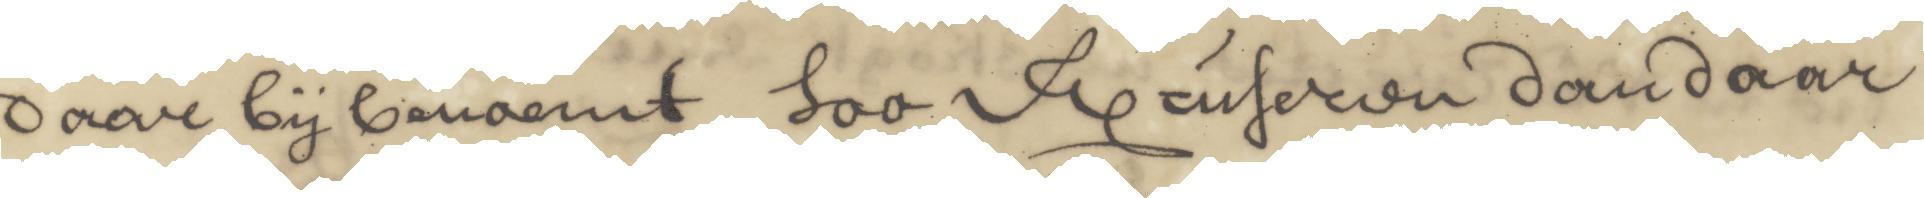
daar bij benoemt, soo Excuseren dan daar
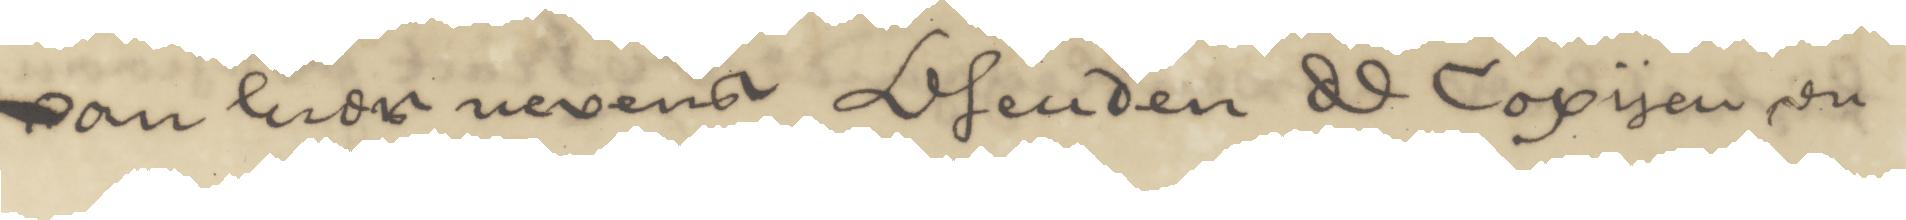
van hier nevens tesenden de Copijen en
